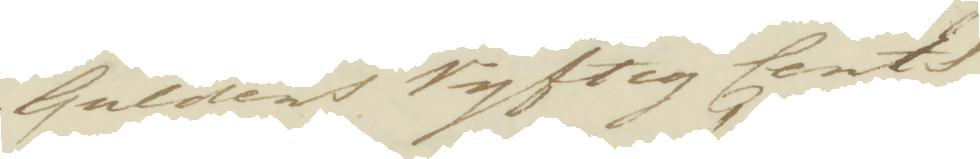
Guldens Vijftig Cents
